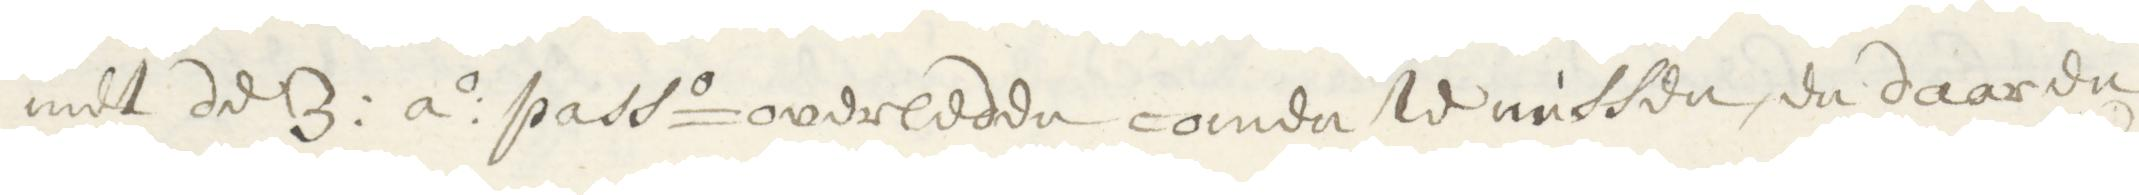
met de 3: a:o pass=o overleden comen te missen, en daar en
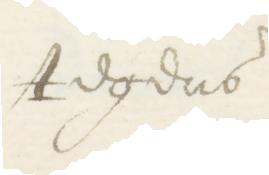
tegens
